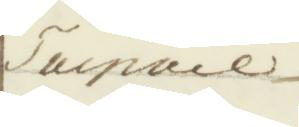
Toepoel
